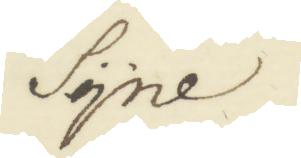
sijne
